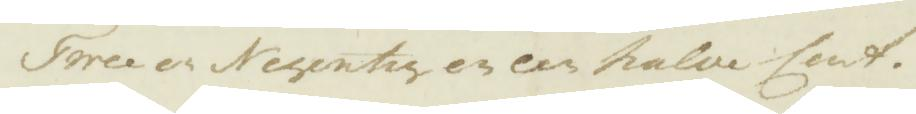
Twee en Negentig en een halve Cent.
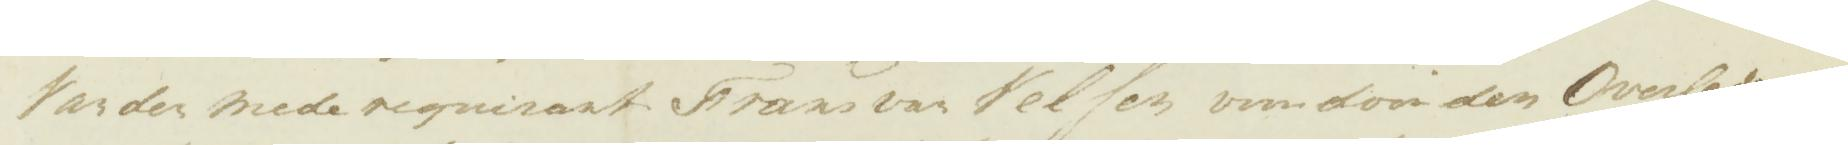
Van den mede requirant Frans van Velsen van door den Overledenen
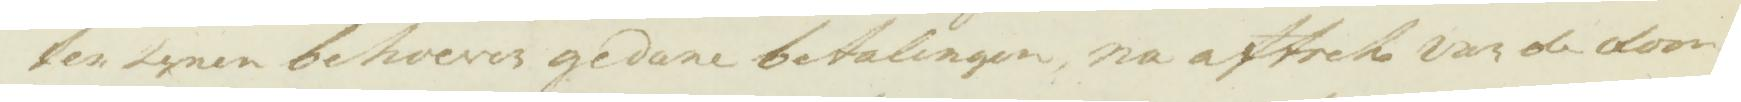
ten zynen behoeven gedane betalingen, na aftrek van de door
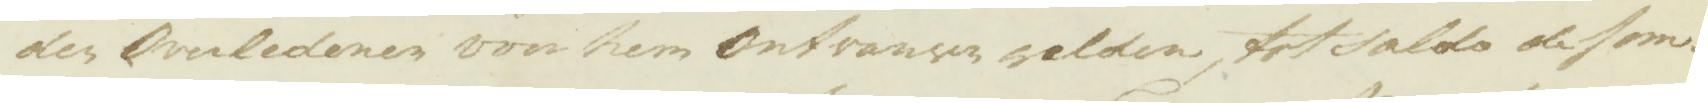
den overledenen voor hem ontvangen gelden, tot saldo de som„
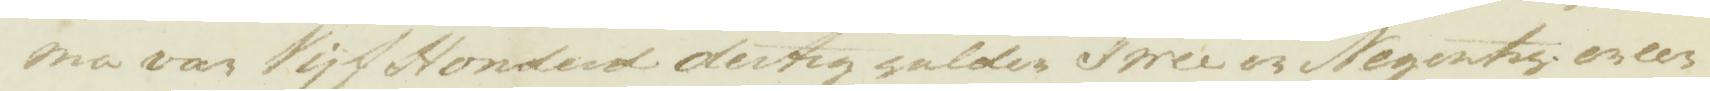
ma van Vijf Honderd dertig gulden Twee en Negentig en een
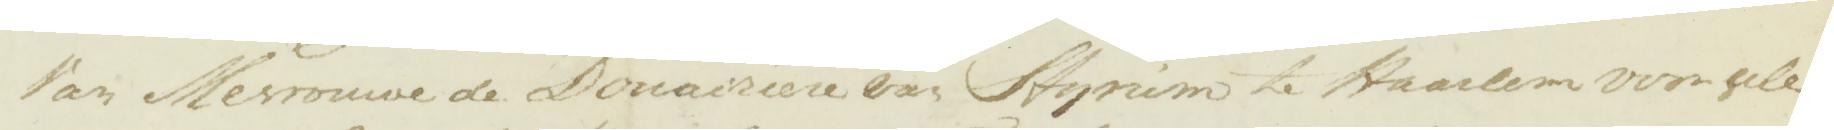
Van Mevrouw de Douairiere van Styrum te Haarlem voor gele
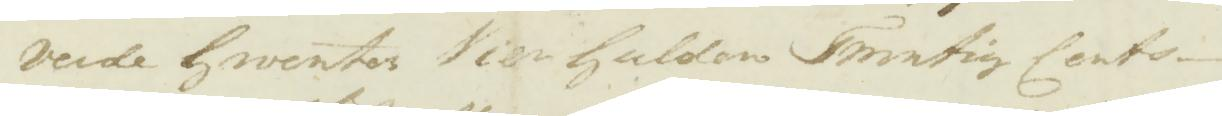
verde Groenten Vier Gulden Twintig Cents.
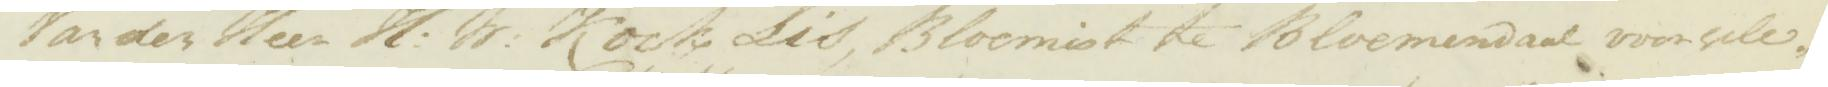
Van den Heer H:W: Kock Lis, Bloemist te Bloemendaal voor gele„
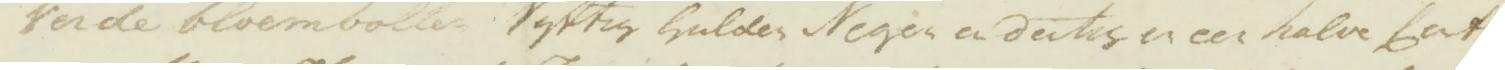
verde bloembollen Vyftig Gulden Negen en dertig en een halve Cent.
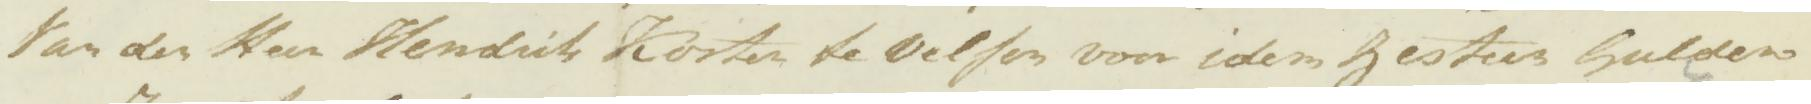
Van den Heer Hendrik Korsten te Velsen voor idem Zestien Gulden
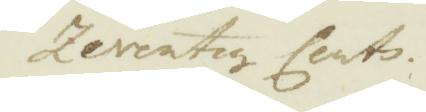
Zeventig Cents.
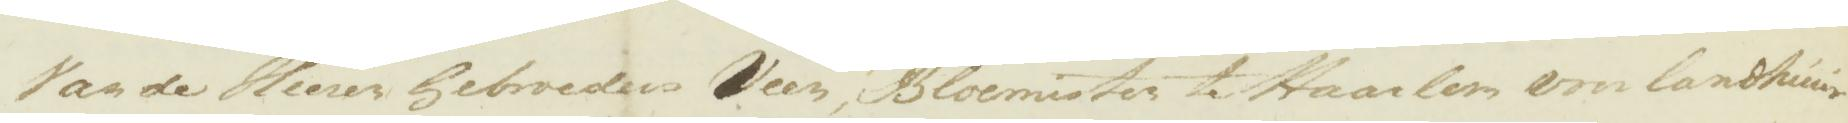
Van de Heeren Gebroeders Veen, Bloemisten te Haarlem voor landhuur
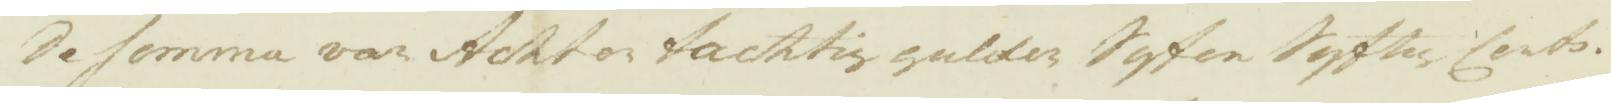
de somma van Acht en tachtig gulden Vyf en Vyftig Cents.
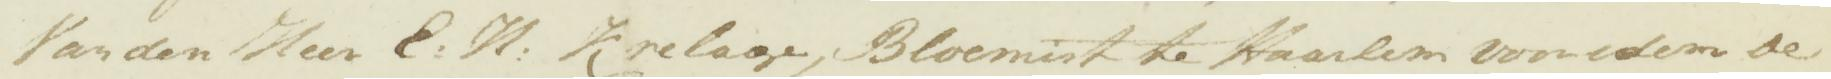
Van den Heer E: H: Krelage, Bloemist te Haarlem voor idem de
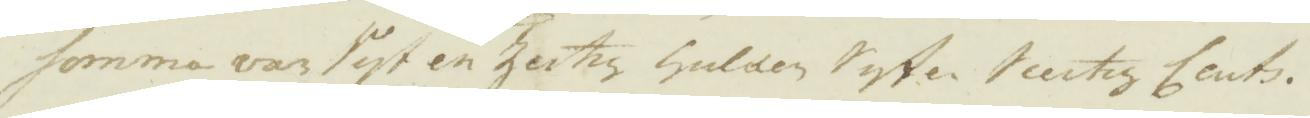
somma van Vyf en Zestig Gulden Vyf en Veertig Cents.
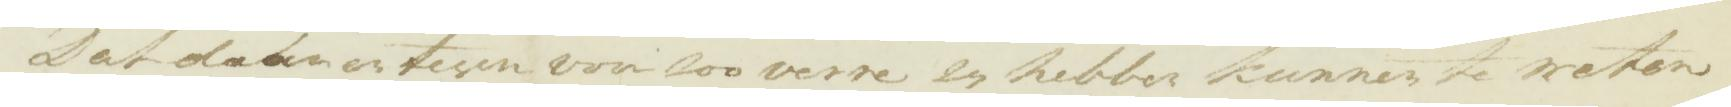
Dat daar en tegen voor zoo verre zy hebben kunnen te weten
